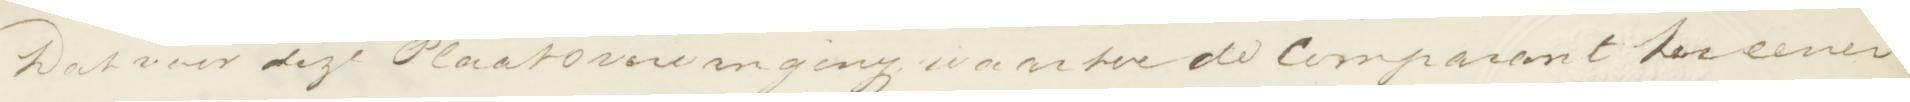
Dat voor deze Plaatsvervanging waartoe de comparant ter eener
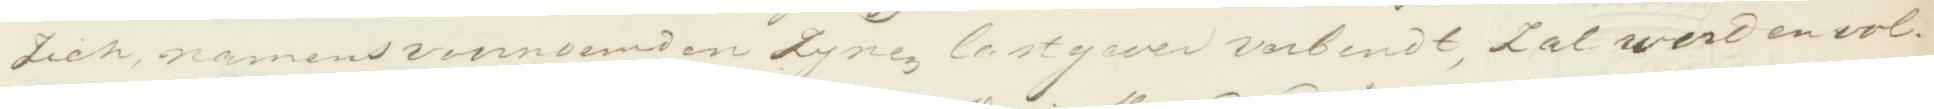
zich, namens voornoemden zijnen lastgever verbindt, zal worden vol„
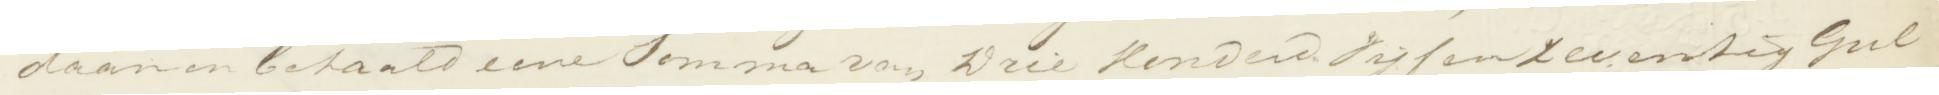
daan en betaald eene somma van Drie honderd Vijf en Zeventig Gul
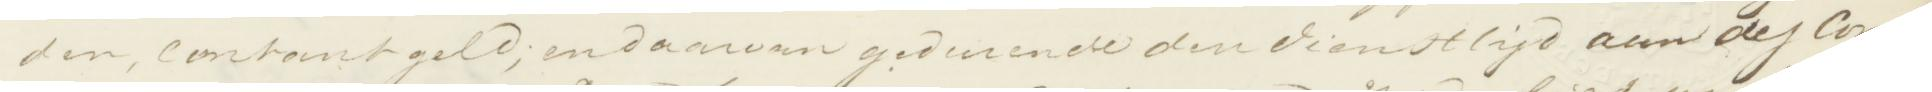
den, contant geld; en daarvan gedurende den diensttijd aan des com
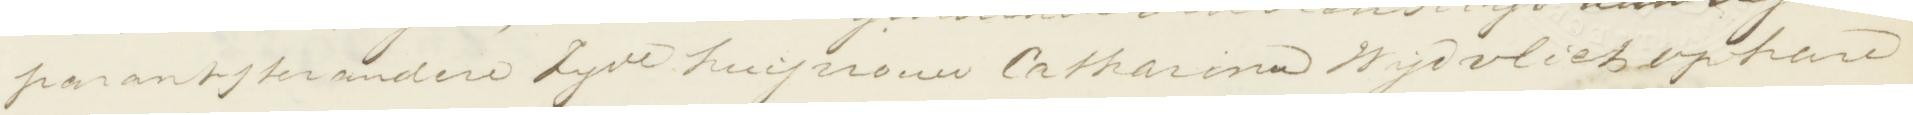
parants ter andere zyde huisvrouw Catharina Wijdvliet op hare
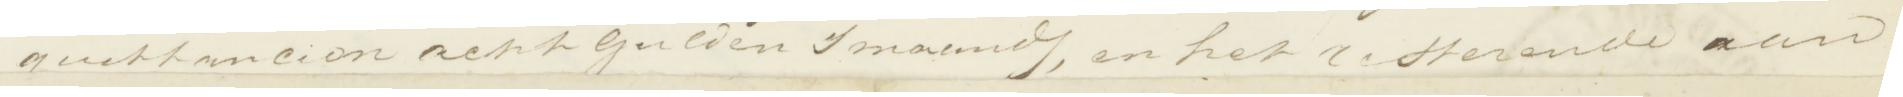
quittancien acht guldens maands, en het resterende aan
